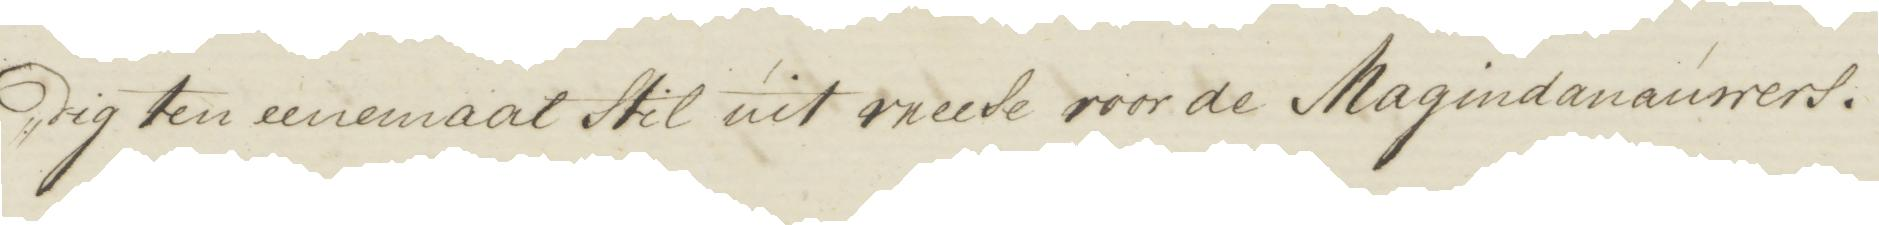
„dig ten eenemaal stil uit vreese voor de Magindanauwers.
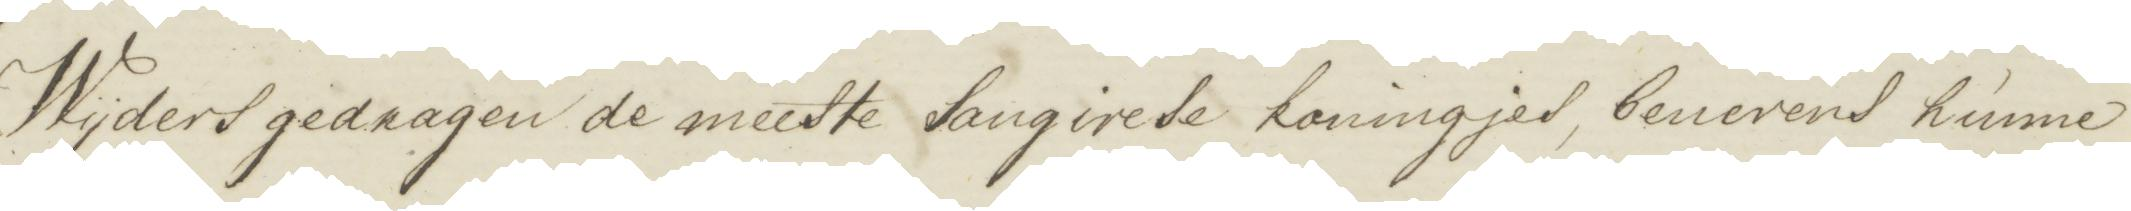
Wijders gedragen de meeste sangirese koningjes, benevens hunne
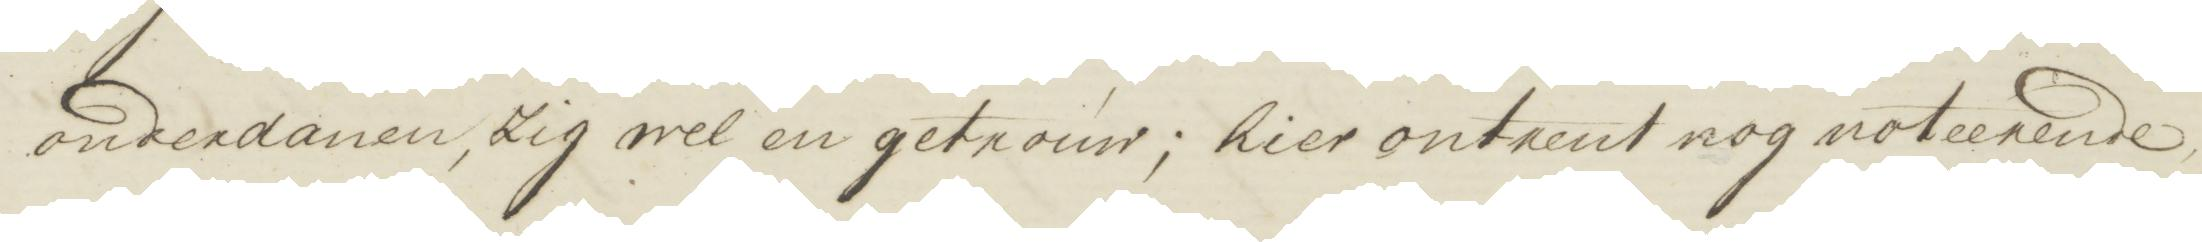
onderdanen, zig wel en getrouw; hier ontrent nog noteerende,
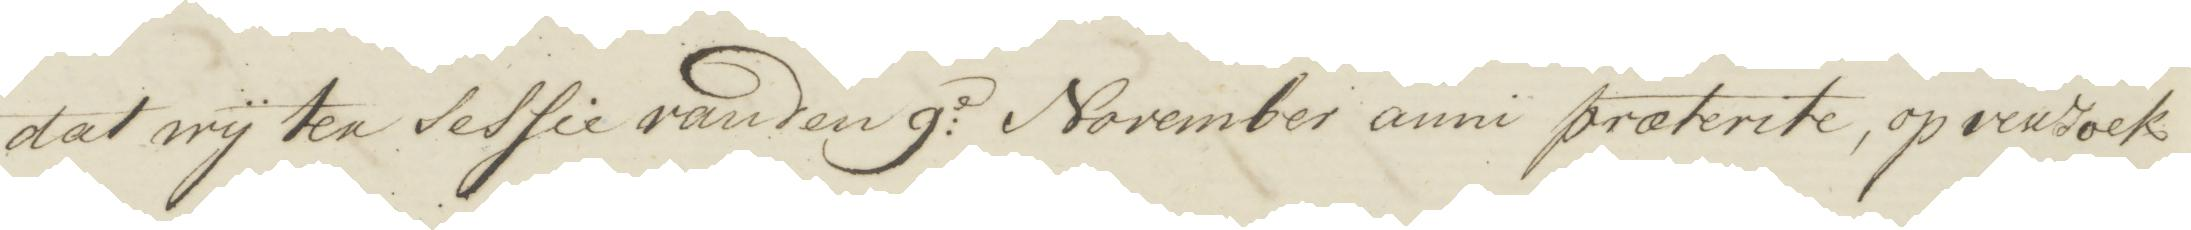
dat wij ter sessie van den 9:e November anni praeterite, op verzoek
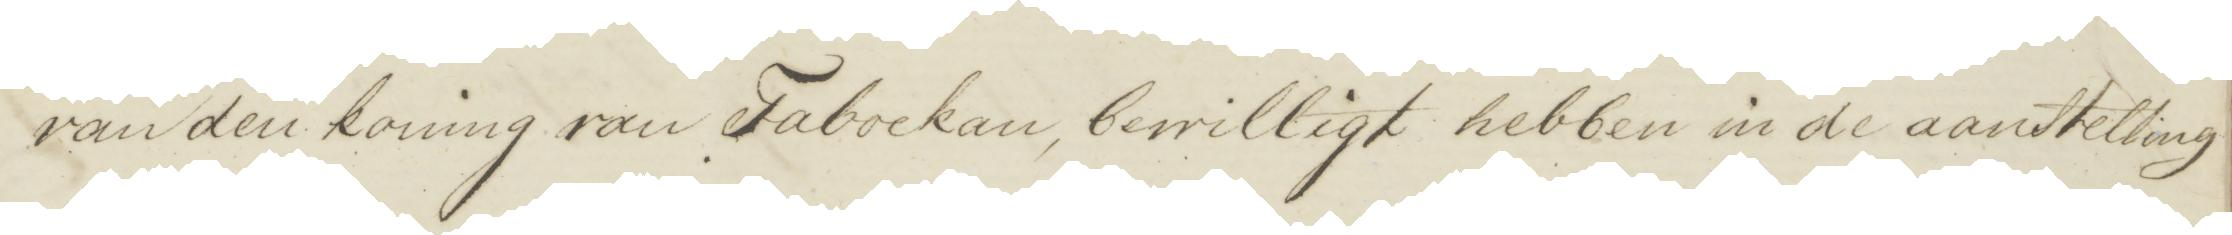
van den koning van Taboekan, bewilligt hebben in de aanstelling
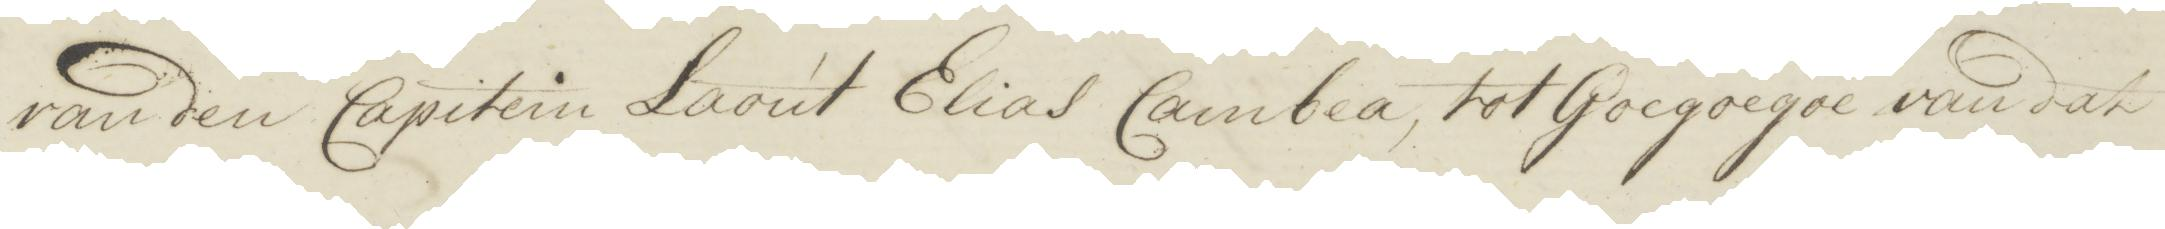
van den Capitein Laout Elias Cambea, tot Goegoegoe van dat
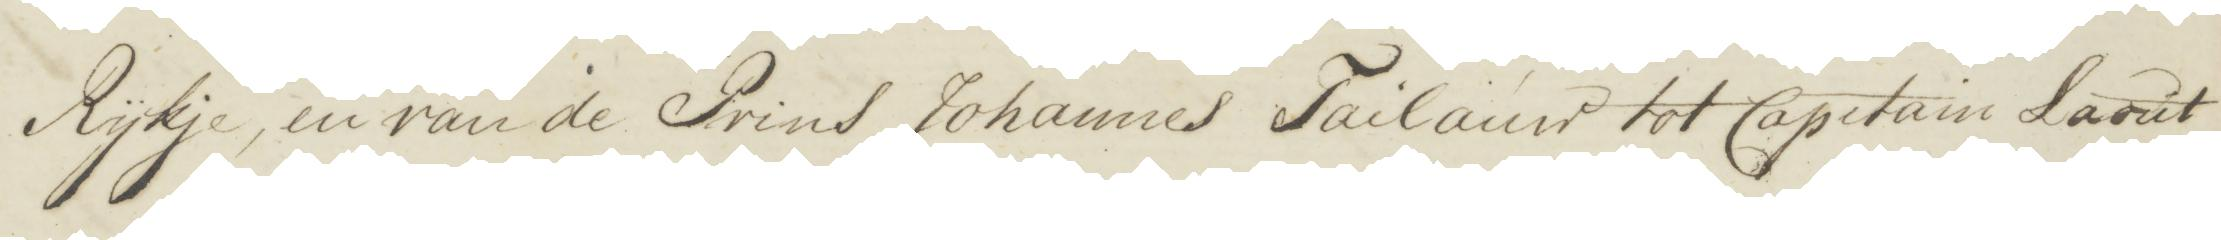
Rijkje, en van de Prins Johannes Tailauw tot Capitain Laout
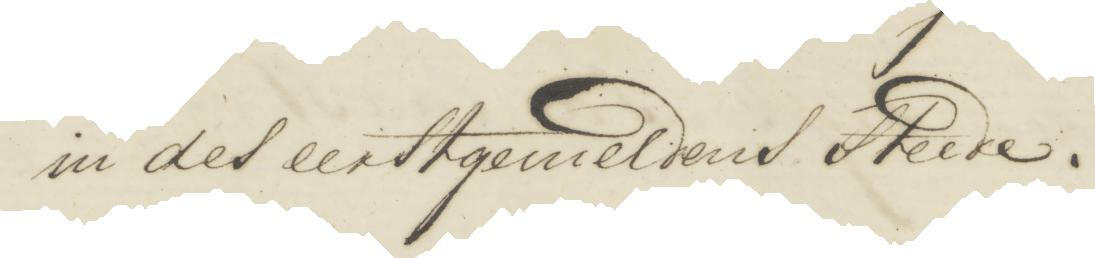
in des eerstgemeldens steede.
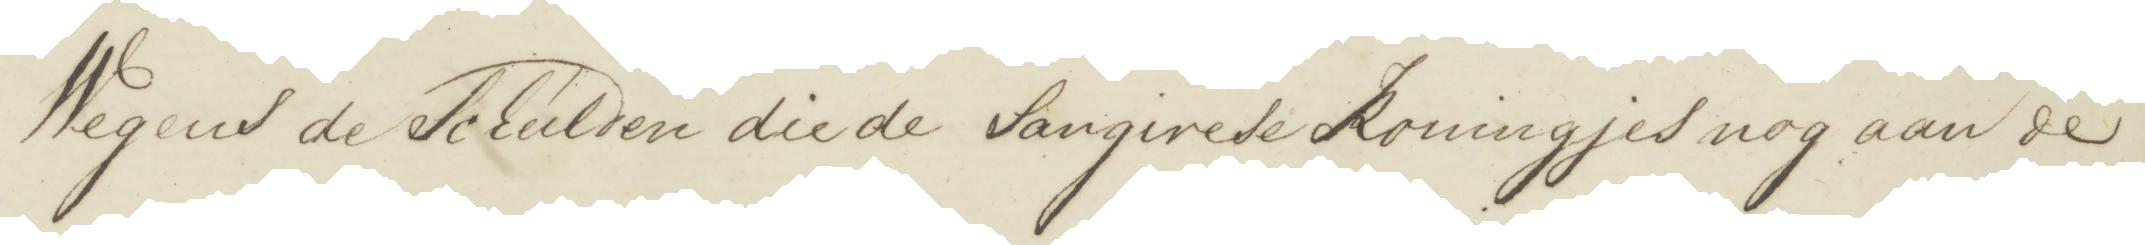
Wegens de schulden die de Sangirese Koningjes nog aan de
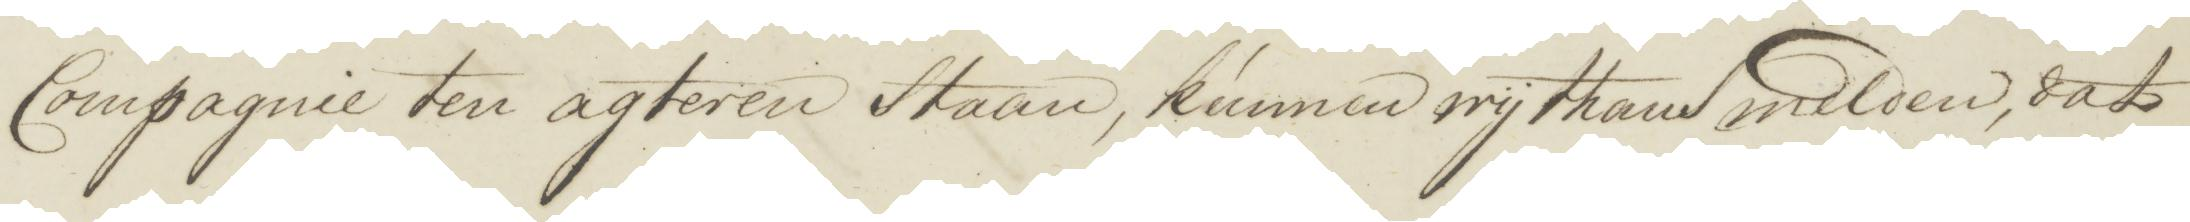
Compagnie ten agteren staan, kunnen wij thans melden, dat
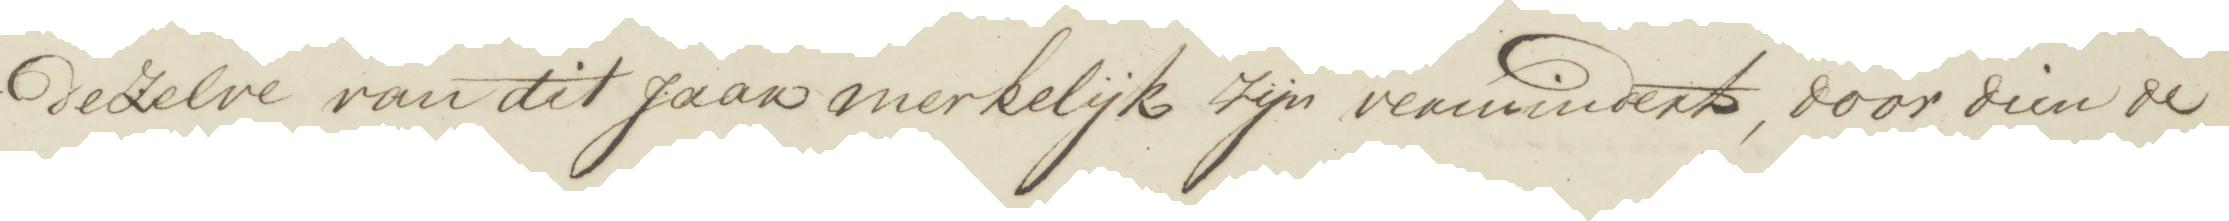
dezelve van dit jaar merkelijk zijn vermindert, door dien de
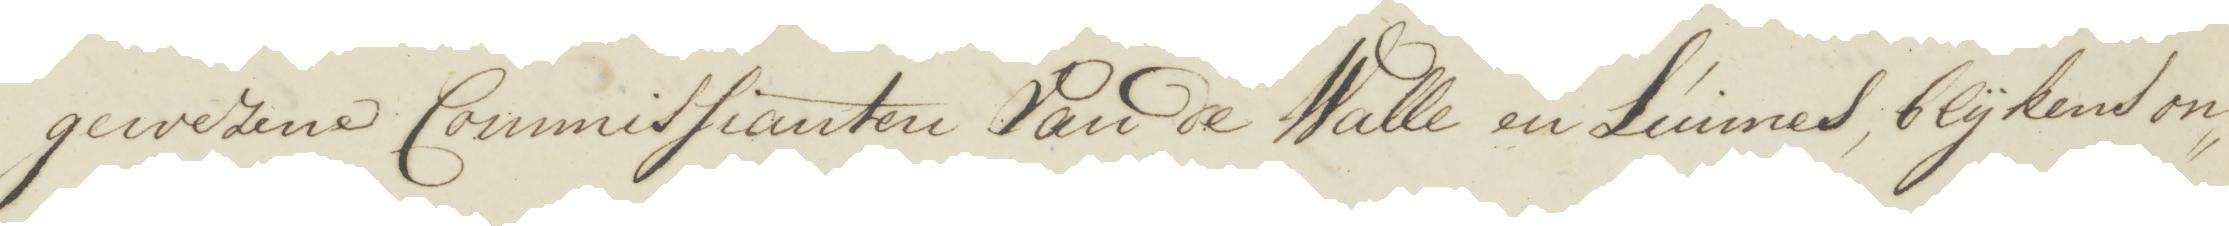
gewezene Commissianten Van de Walle en Luimes, blijkens on„
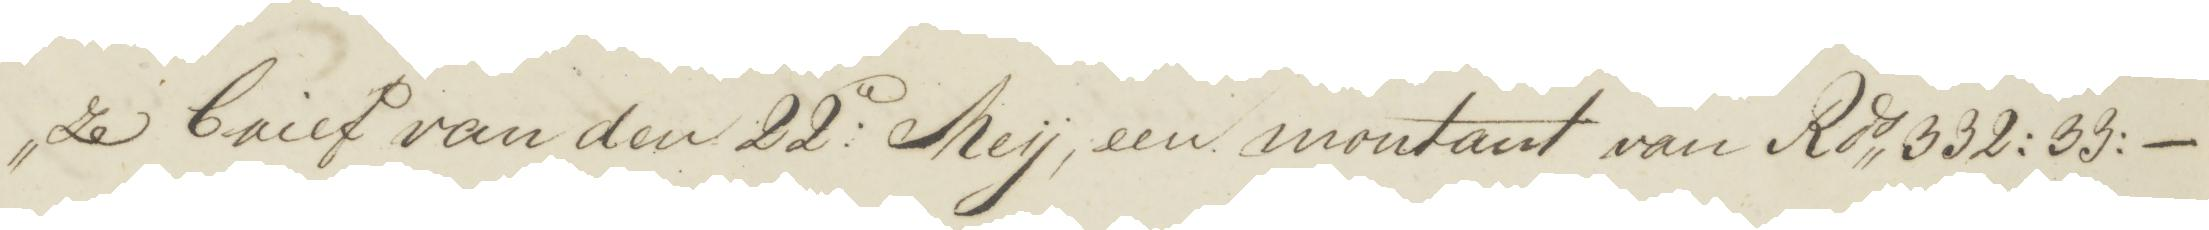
„ze brief van den 22:e Meij, een montant van Rd„s 332:33:—
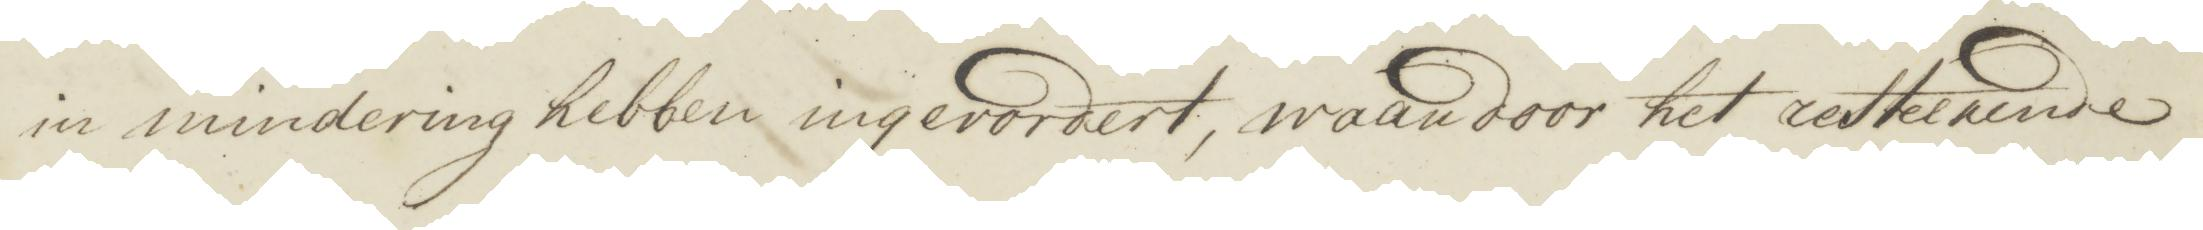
in mindering hebben ingevordert, waardoor het resteerende
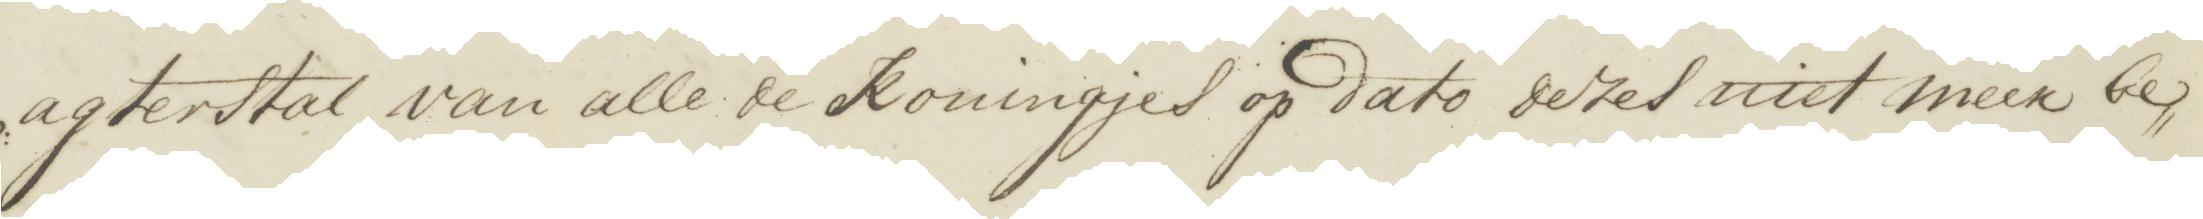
agterstal van alle de Koningjes op dato dezes niet meer be„
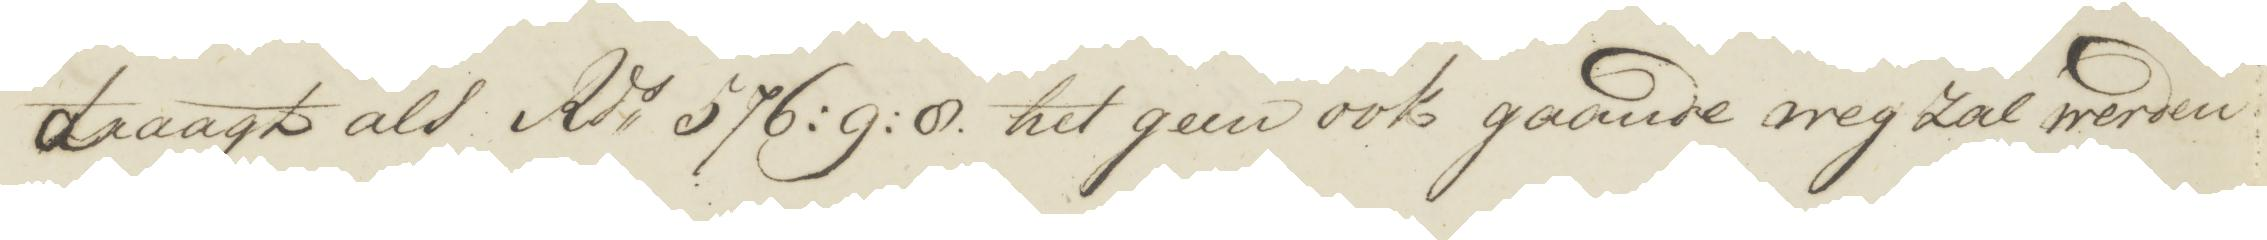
draagt als Rd„s 576:9:8. het geen ook gaande weg zal werden
